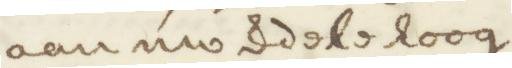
aan uw Edele hoog
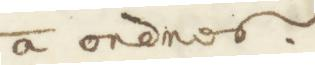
a ordres.
